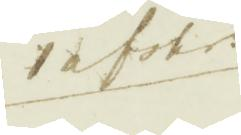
1 afstr
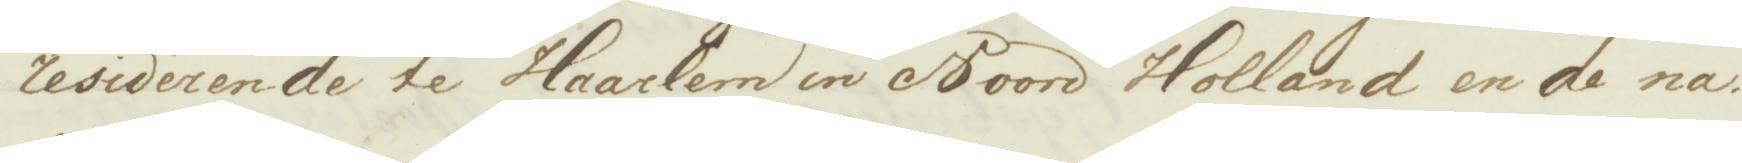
residerende te Haarlem in Noord Holland en de na„
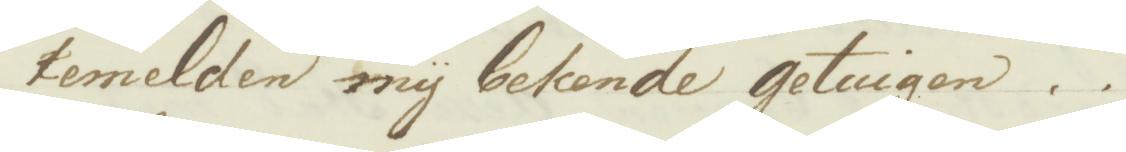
temelden mij bekende getuigen .
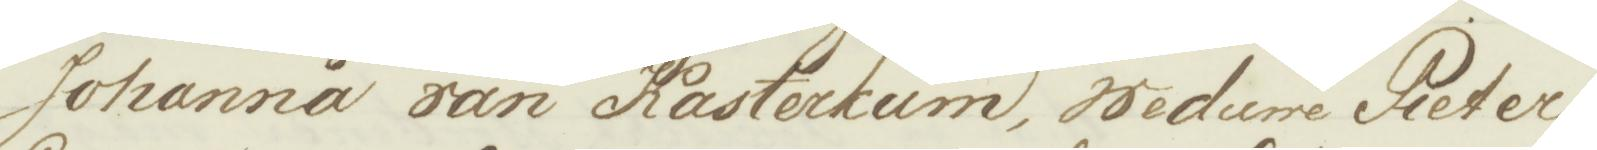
Johanna van Kasterkum, Weduwe Pieter
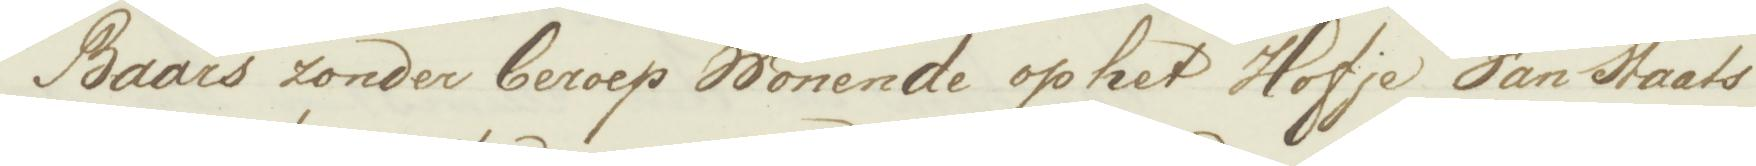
Baars zonder beroep Wonende op het Hofje van staats
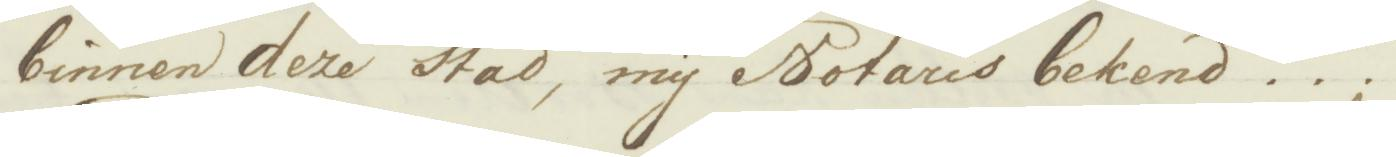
binnen deze stad, mij Notaris bekend . . .
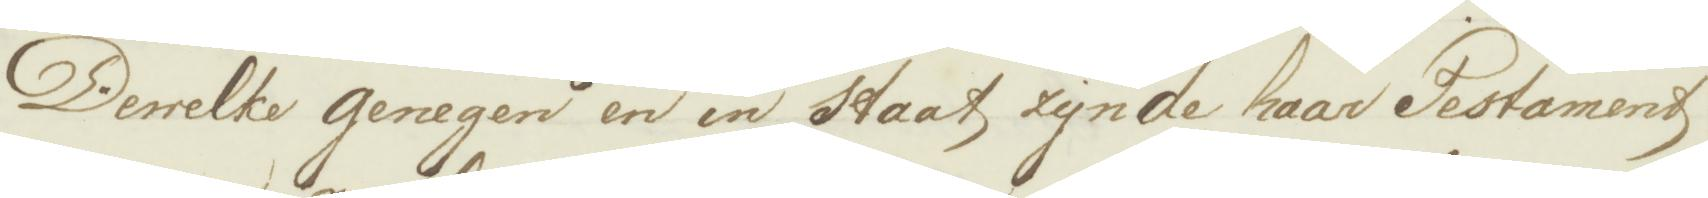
Dewelke genegen en in staat zijnde haar Testament
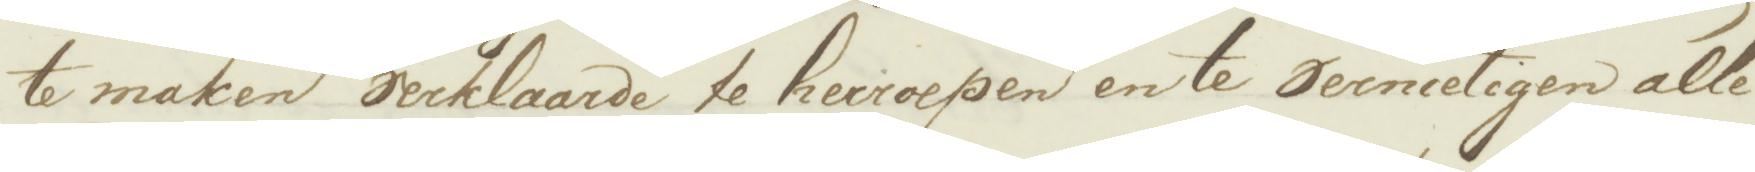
te maken verklaarde te herroepen en te vernietigen alle
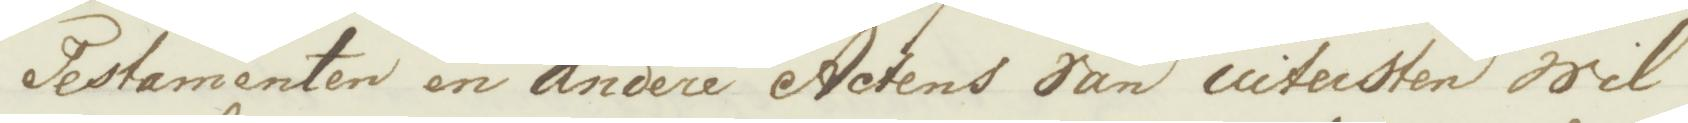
Testamenten en Andere Actens van uitersten wil
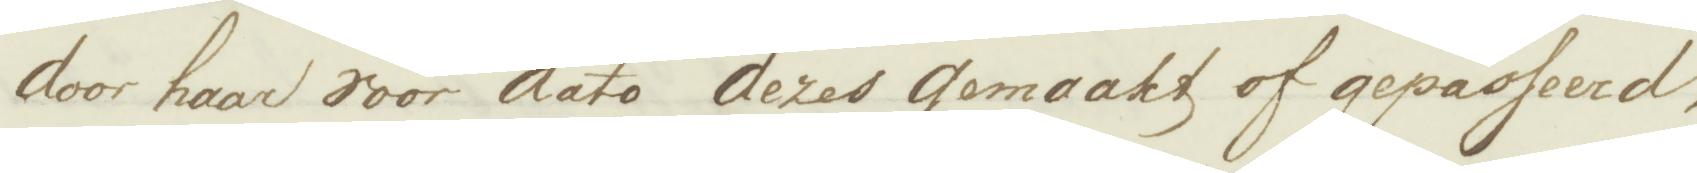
door haar voor dato dezes gemaakt of gepasseerd
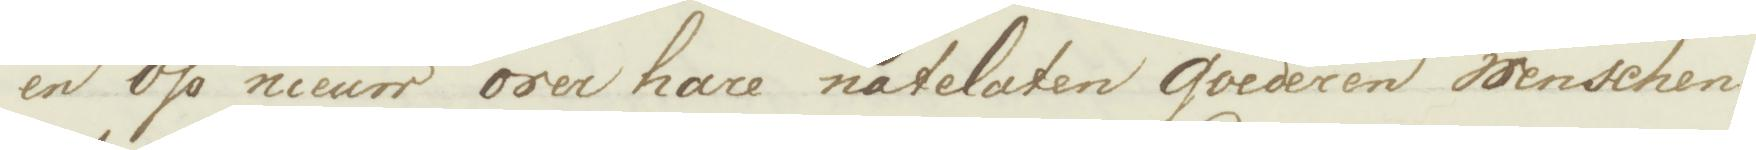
en op nieuw over hare natelaten goederen wenschen
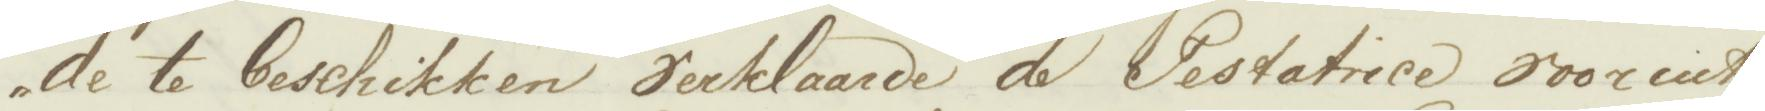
„de te beschikken verklaarde de Testatrice voor uit
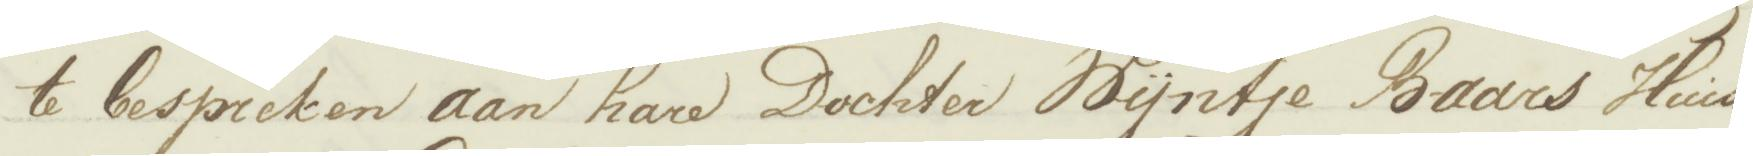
te bespreken aan hare Dochter Wijntje Baars Huis,
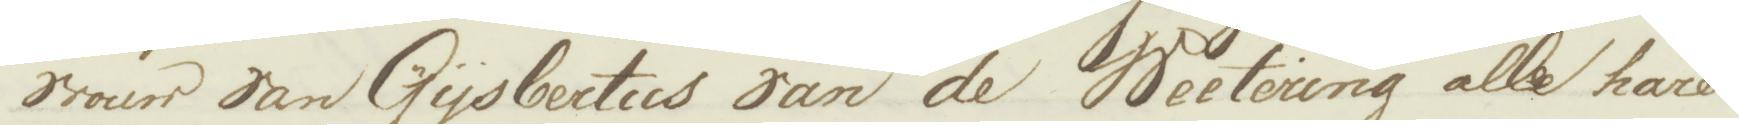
vrouw van Gijsbertus van de Weetering alle hare
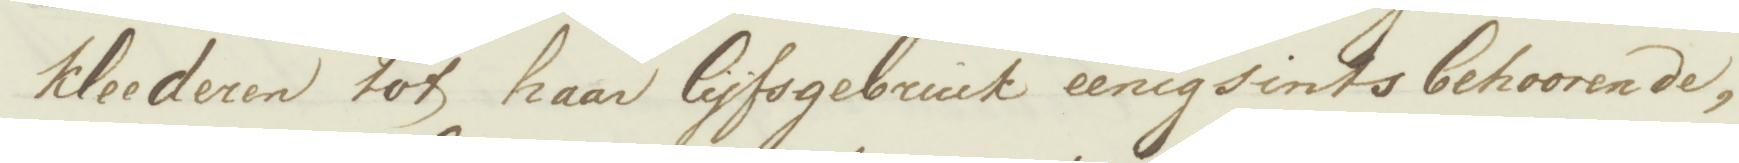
kleederen tot haar lijfsgebruik eenigsints behoorende,
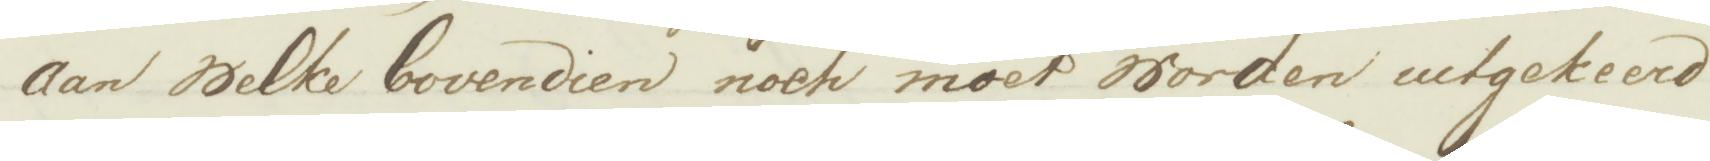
aan welke bovendien noch moet worden uitgekeerd
